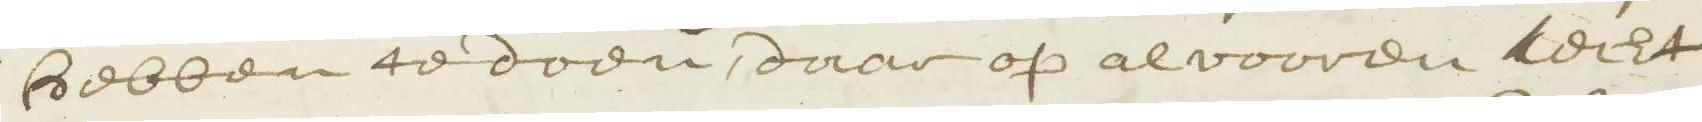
hebben te doen, daar op alvooren recht
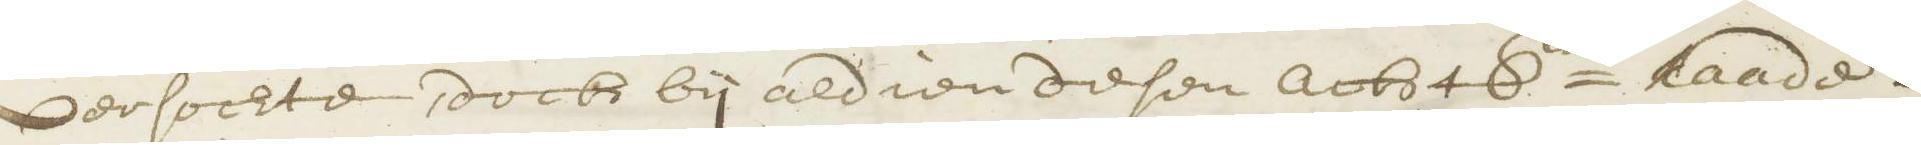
versochte, doch bij aldien desen achtb=ren raade
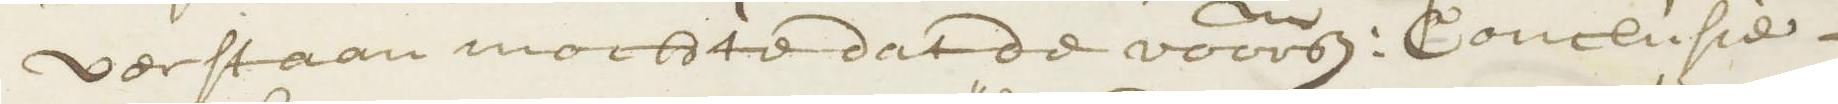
verstaan mochte dat de voorsz: Conclusie
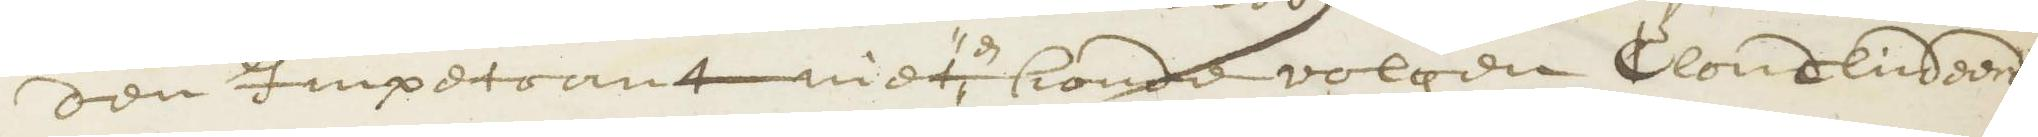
den Impetrant niet konde volgen Concludeerd
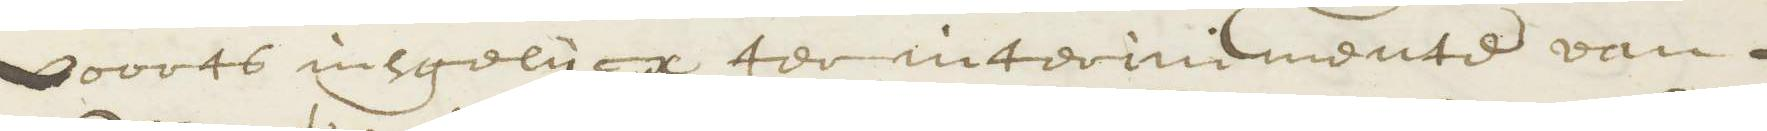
voorts insgelijck ter interinemente van
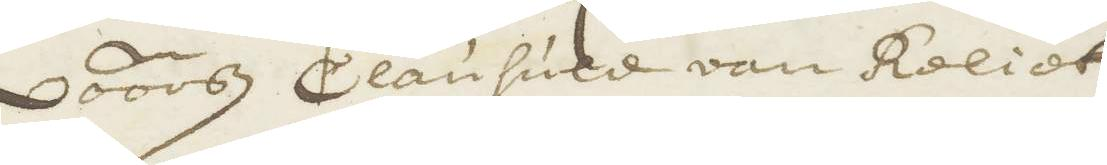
voorsz Clausule van Relieff ende wijders
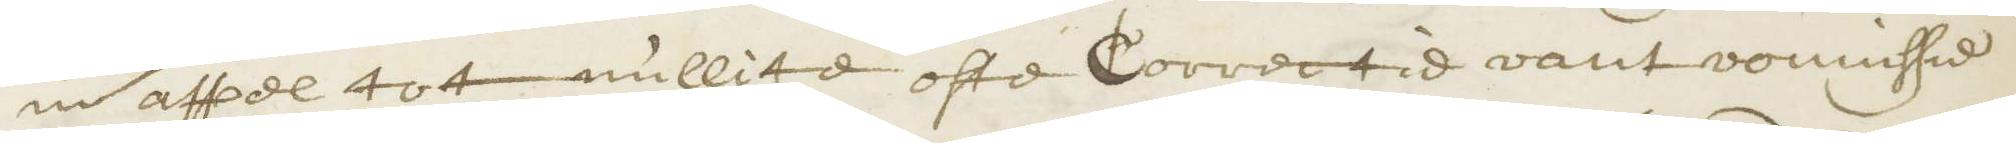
in appel tot nullite ofte Correctie vant vonnissie
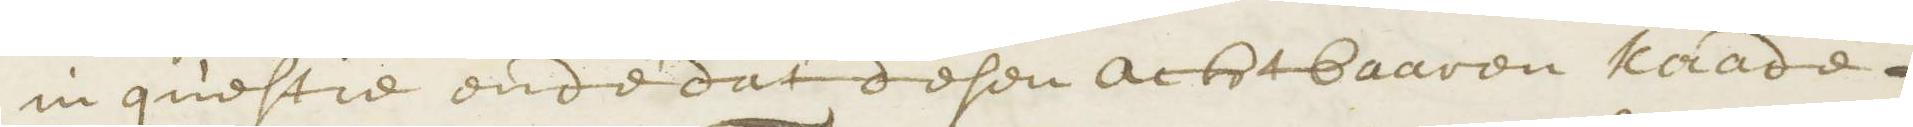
in questie ende dat desen achtbaaren raade
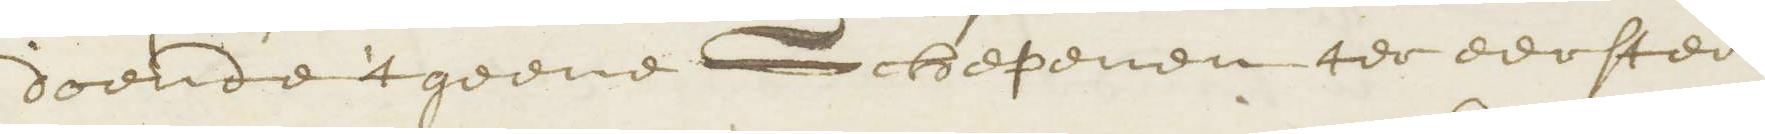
doende ’t geene Schepenen ter eerster
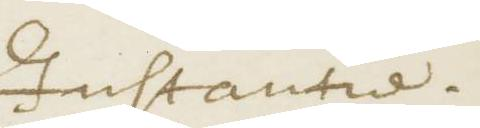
Jnstantie.
